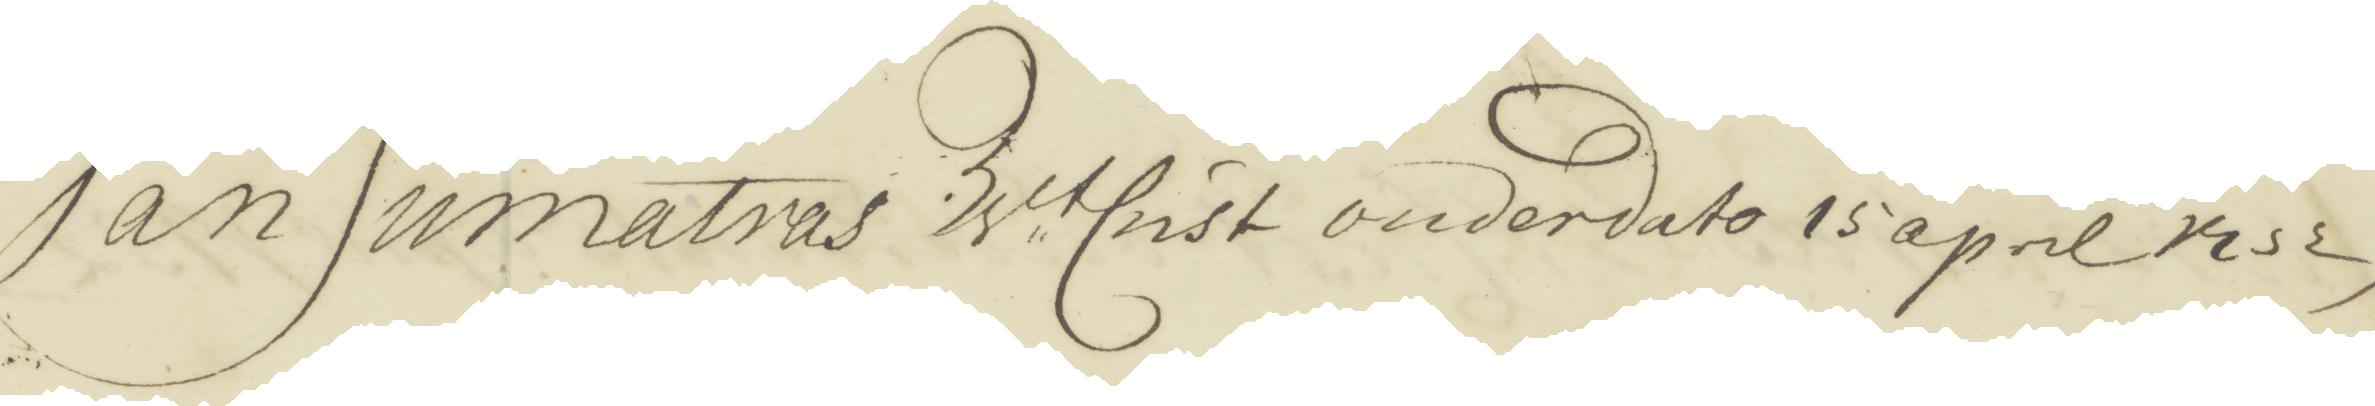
Van Sumatras W„t Cust onderdato 15 april 1752
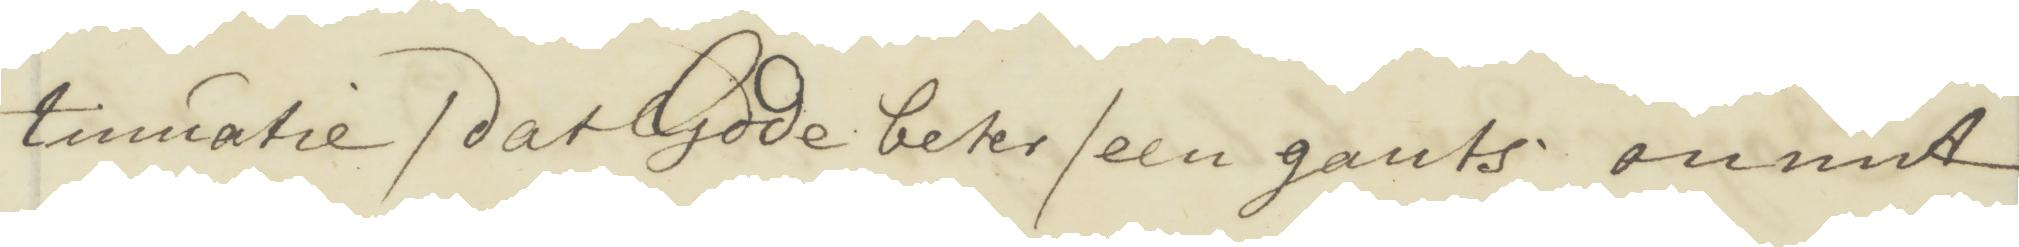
tinuatie / dat Gode beter / een gants onnut
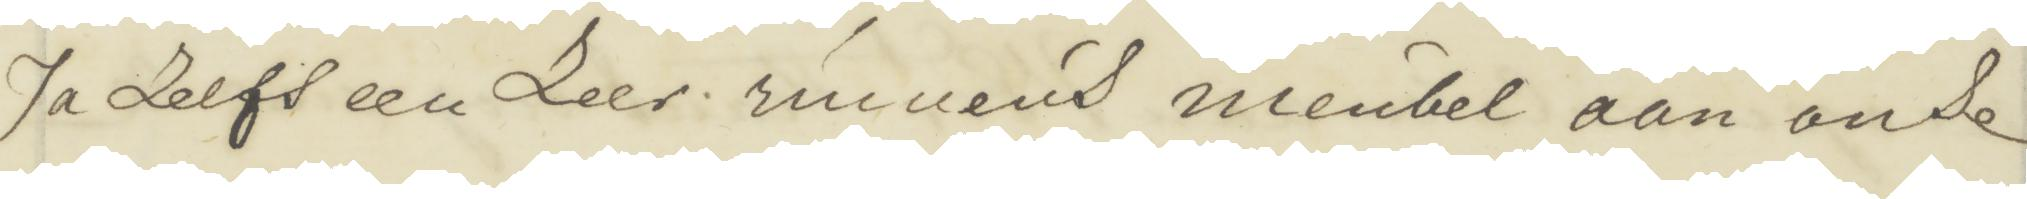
Ja zelfs een zeer ruineus meubel aan onse
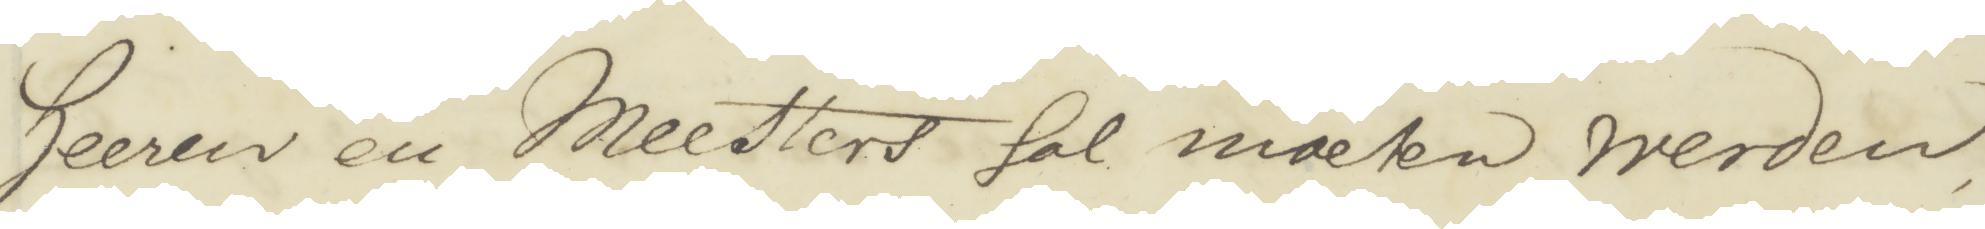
Heeren en Meesters sal moeten werden,
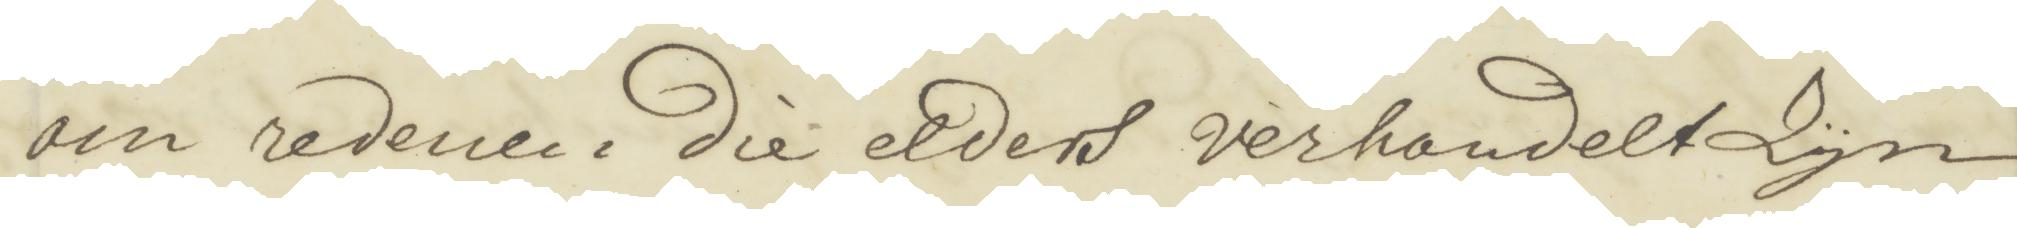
om redenen die elders verhandelt zijn
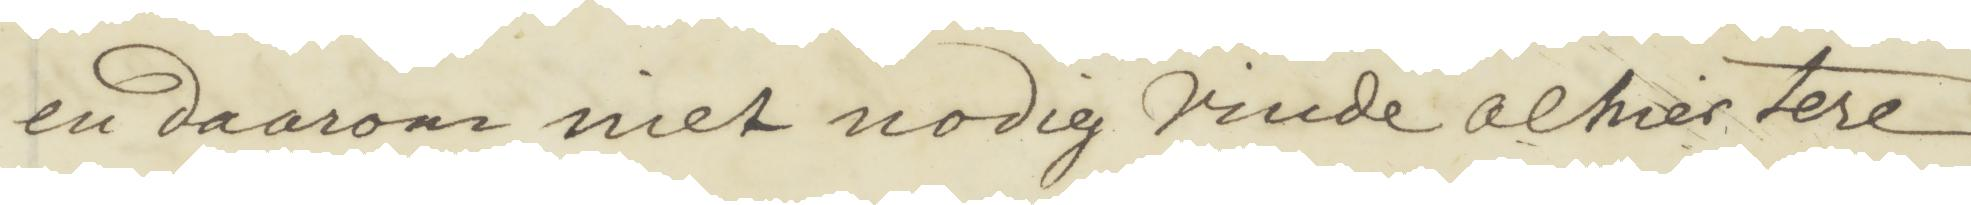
en daarom niet nodig vinde alhier tere
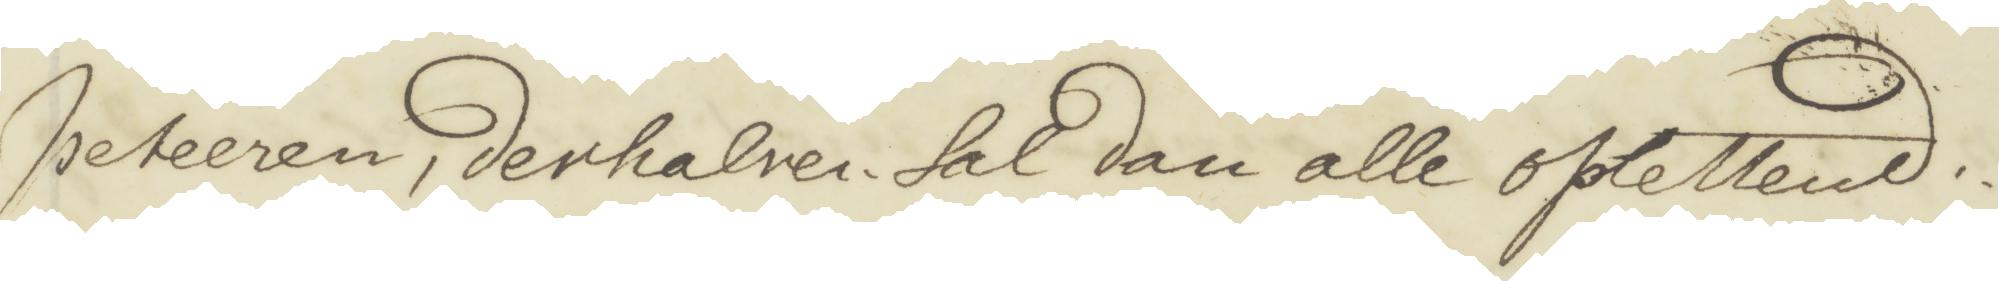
peteeren, derhalven sal dan alle oplettend„
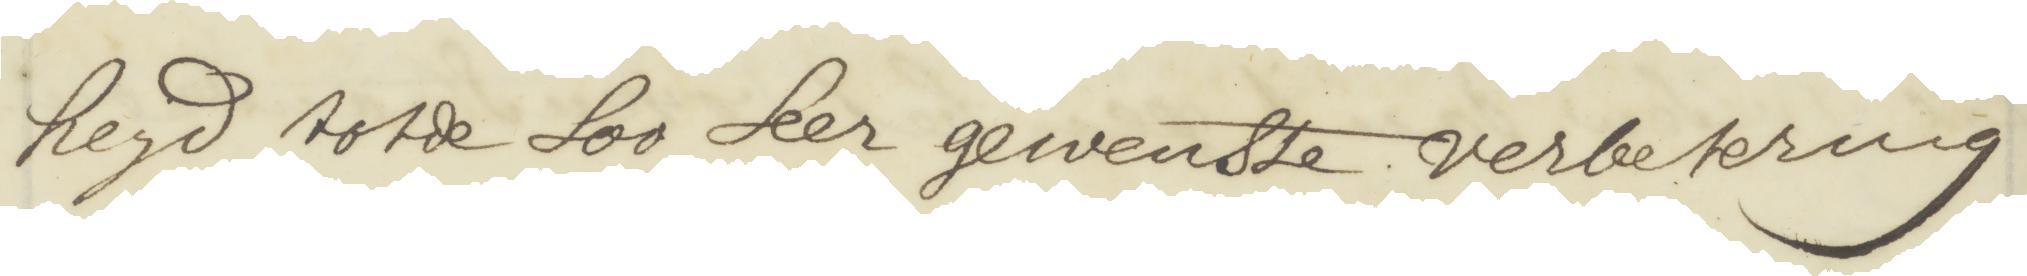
heijd totde soo seer gewenste verbetering
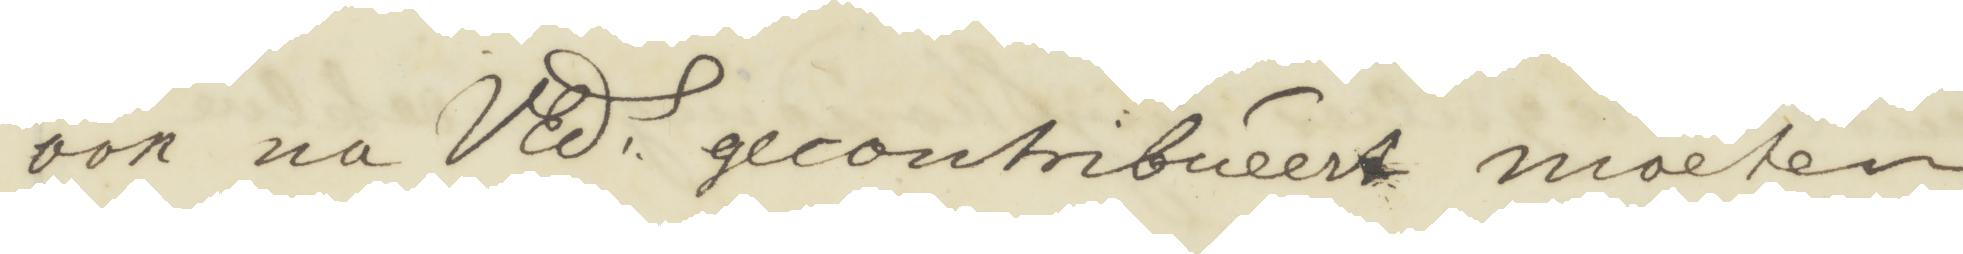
oor na UEd„s gecontribueert moeten
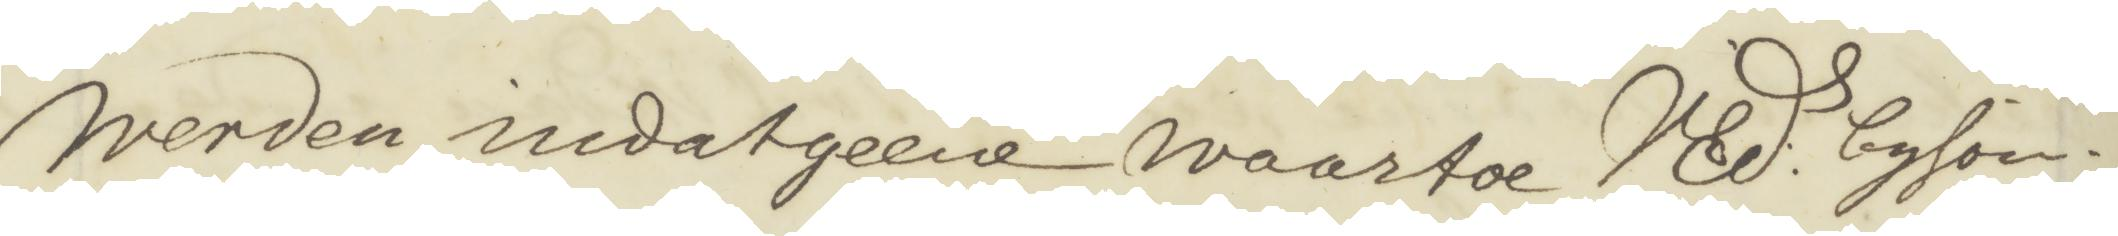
werden in dat geene waartoe UEd:s byson,
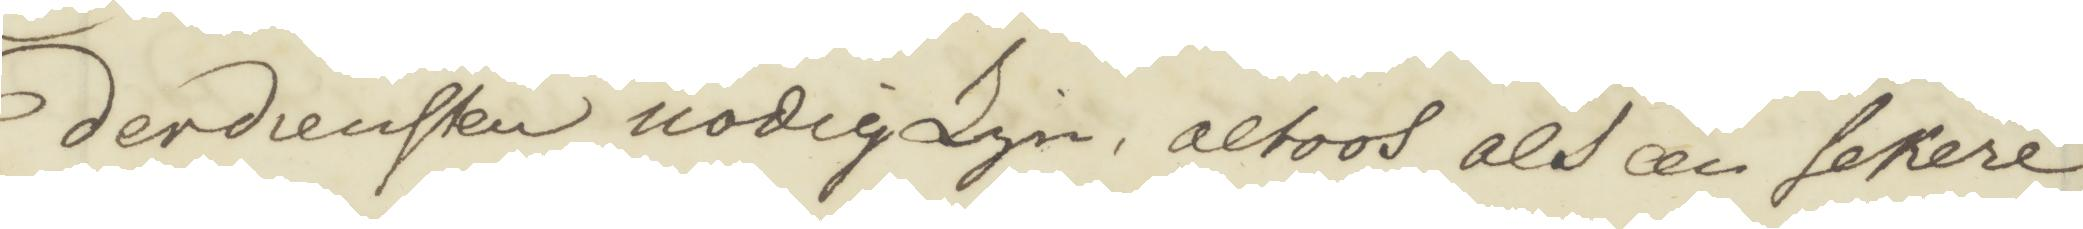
der diensten nodig zijn, altoos als de sekere
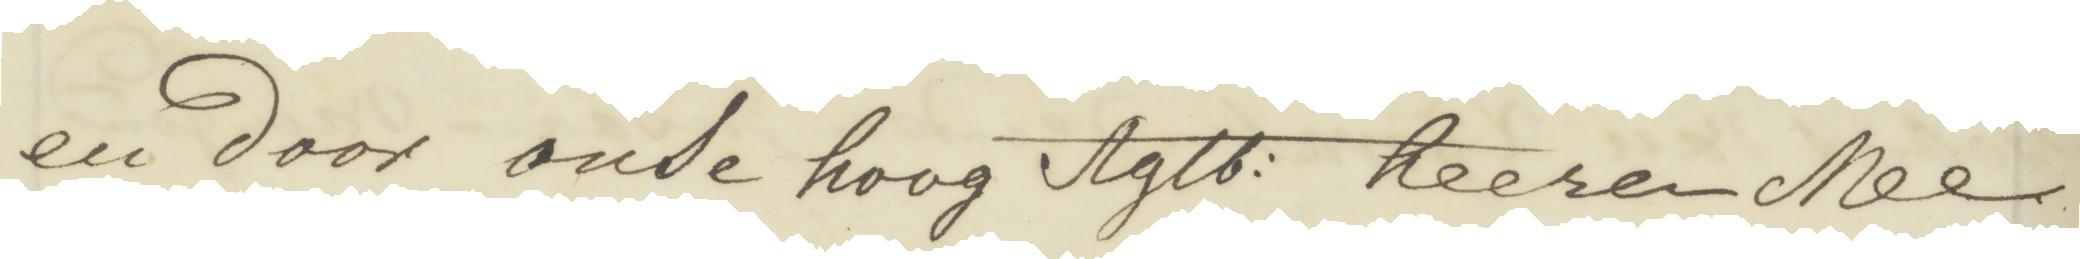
en door onse hoog Agtb: heeren Mee
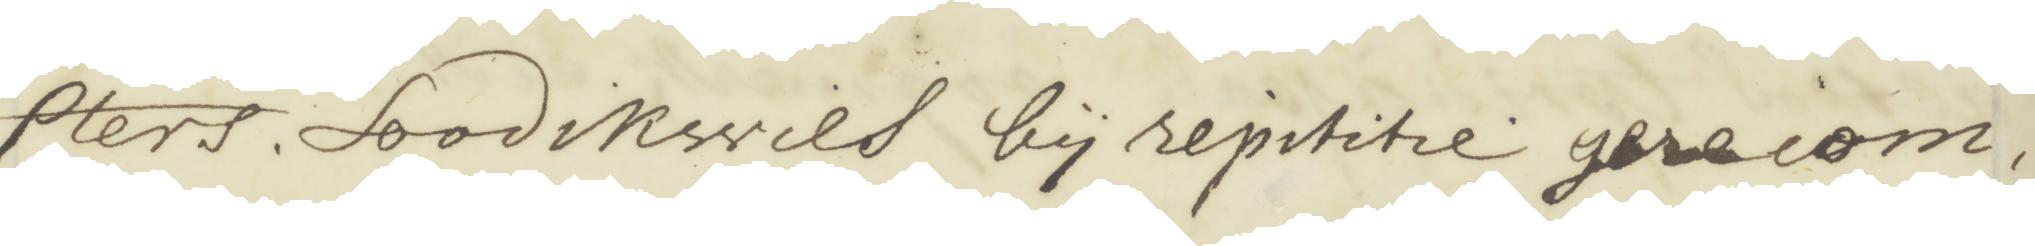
sters soo dikwils bij repititie gerecom„
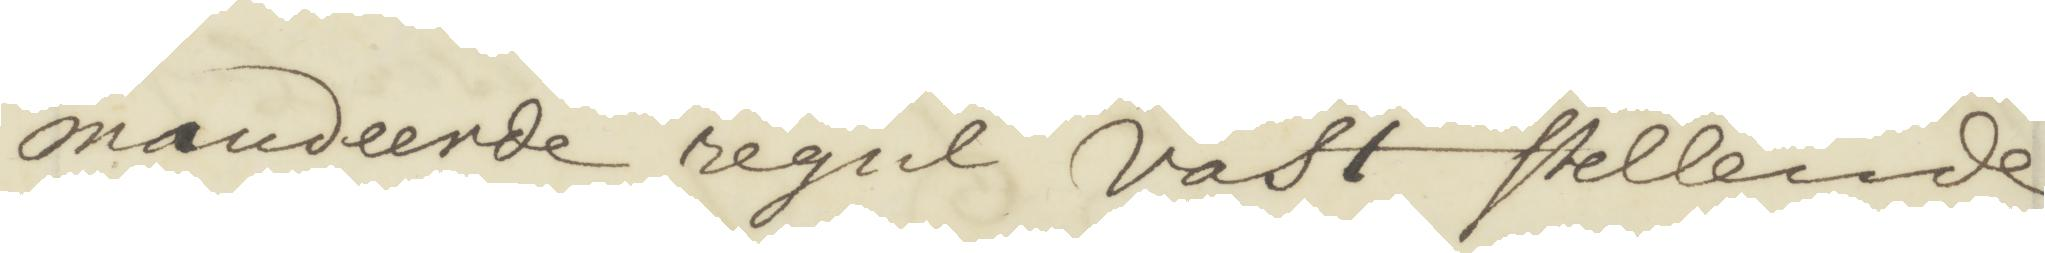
mandeerde regul vaststellende,
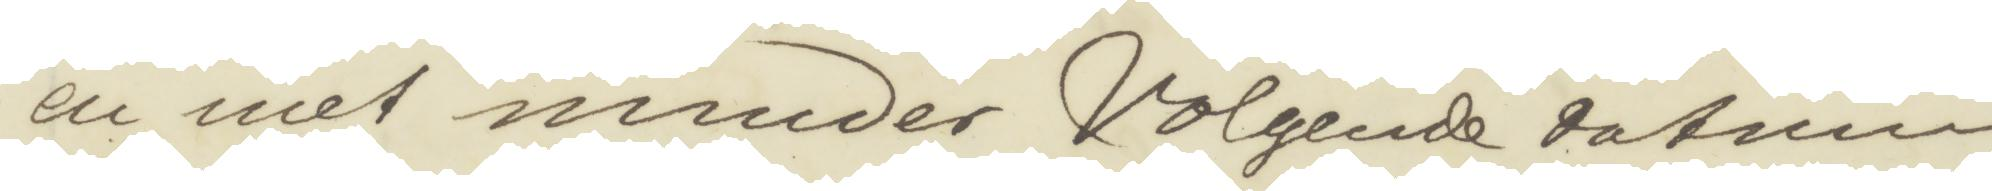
en niet minder volgende tot min
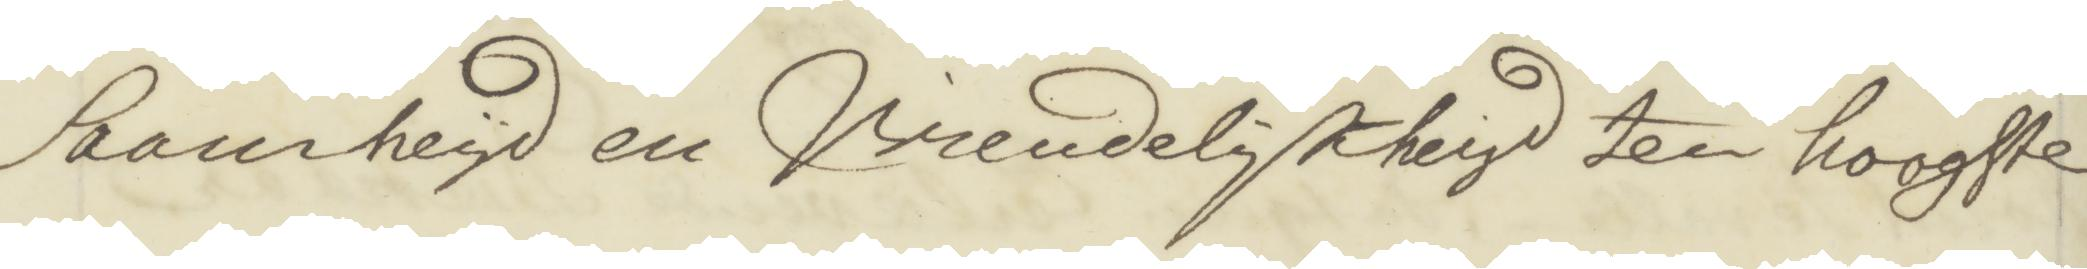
saamheijd en vriendelijkheijd ten hoogste
